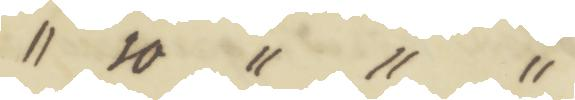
„ 10 „ „ „
